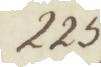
223
